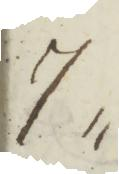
7 „
